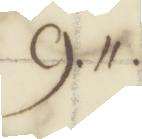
9. „
